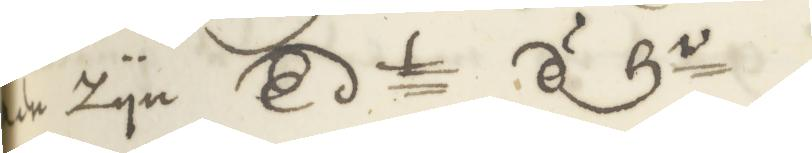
en zijn Ed=t d'h=r
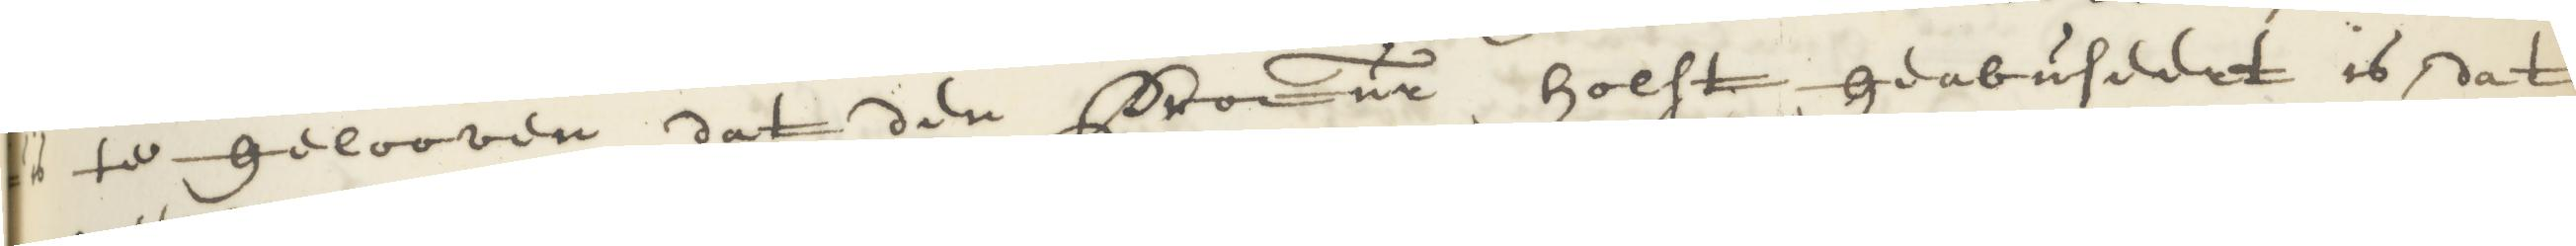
te gelooven dat den procur holst geabuseert is, dat
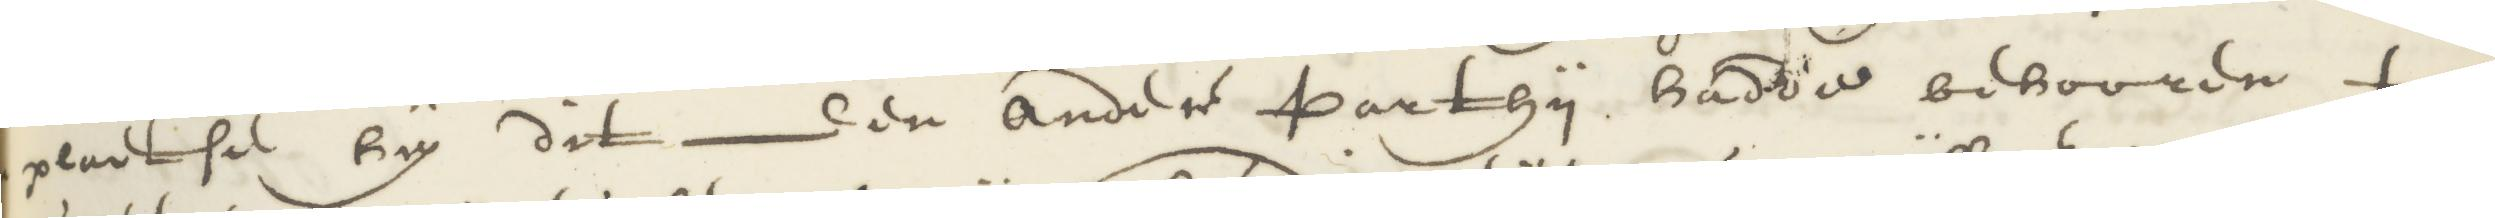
plaetse hij dit een ander parthij hadde behooren te
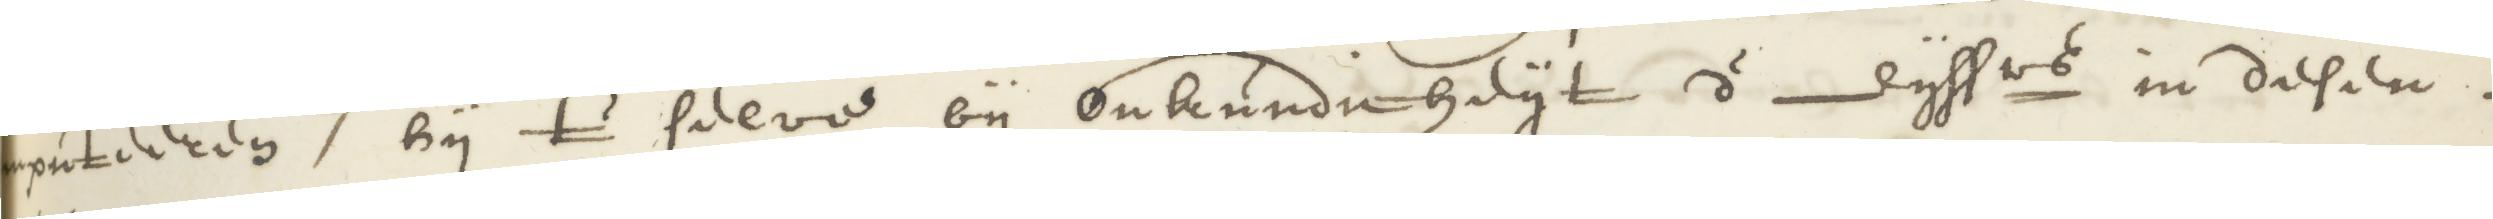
puteeren, bij t' selve bij onkundicheijt d’ eijss=rs in desen
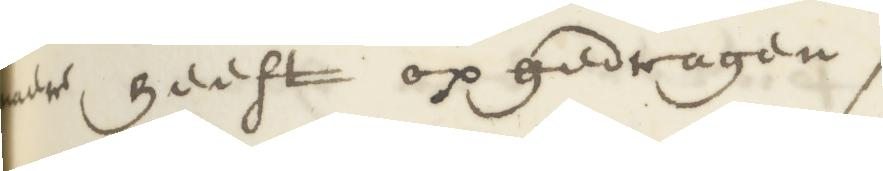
heeft op gedragen
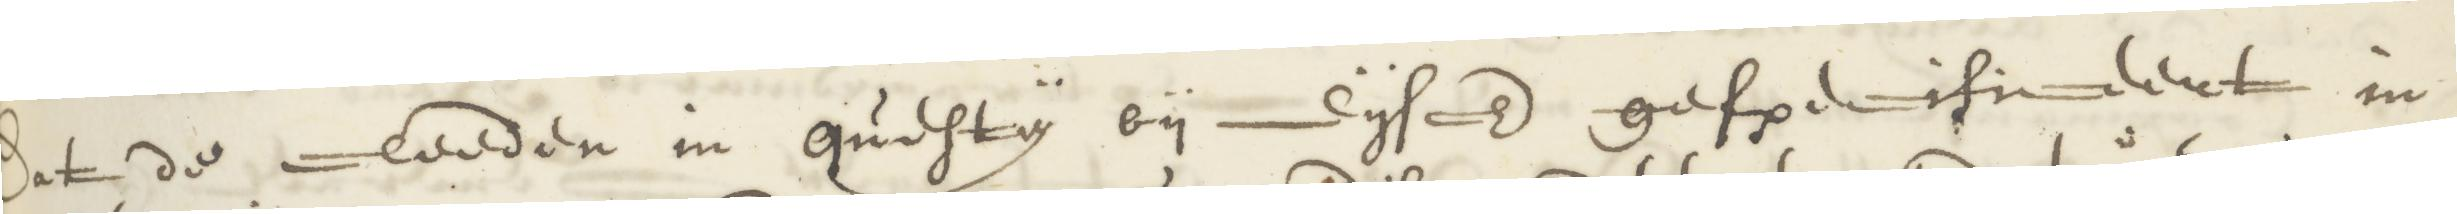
Dat de cleeden in questij bij eijsch gespecificeert in
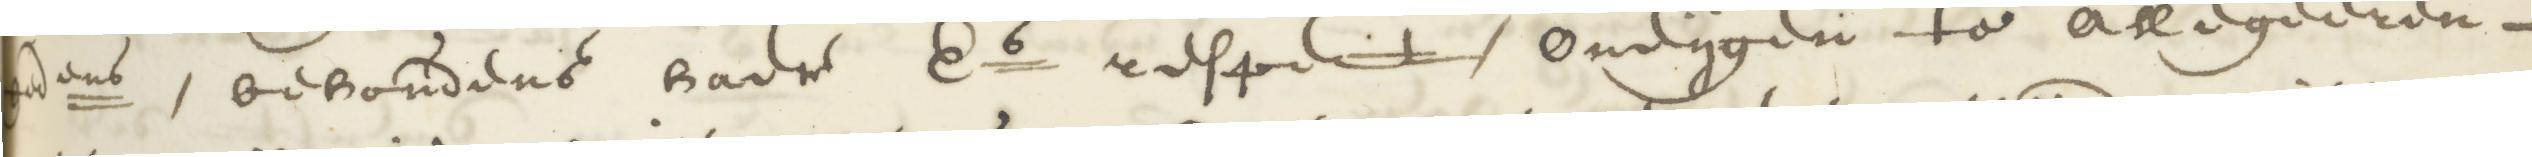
ged=ens, behoudens haer E=s respect, oneijgen te allegeeren-
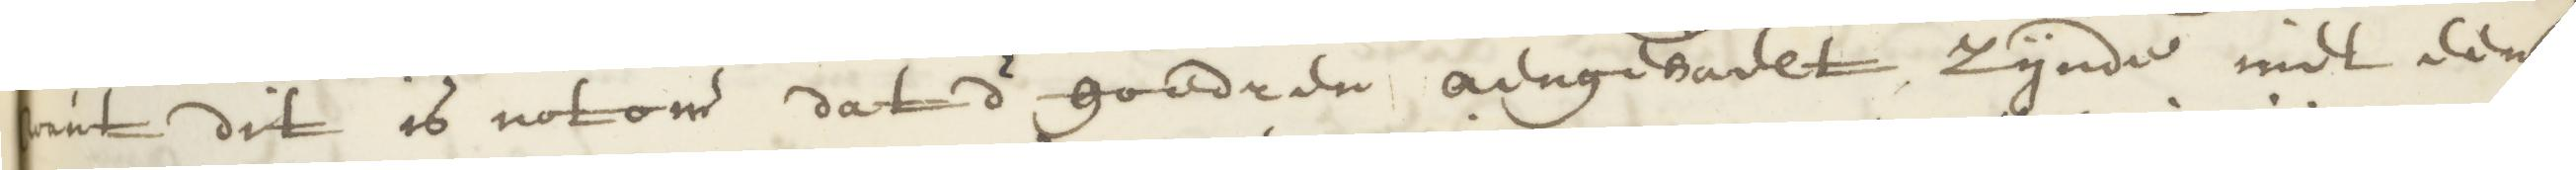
dit is notoir dat d’ goedren aengehaelt, zijnde niet eens
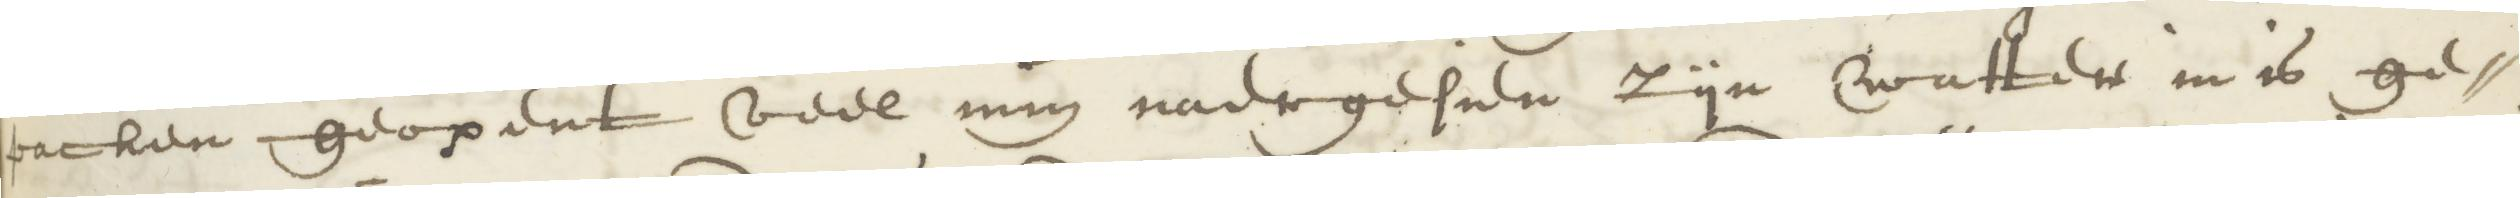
packen geopent veel min naergesien zijn watter in is ge„
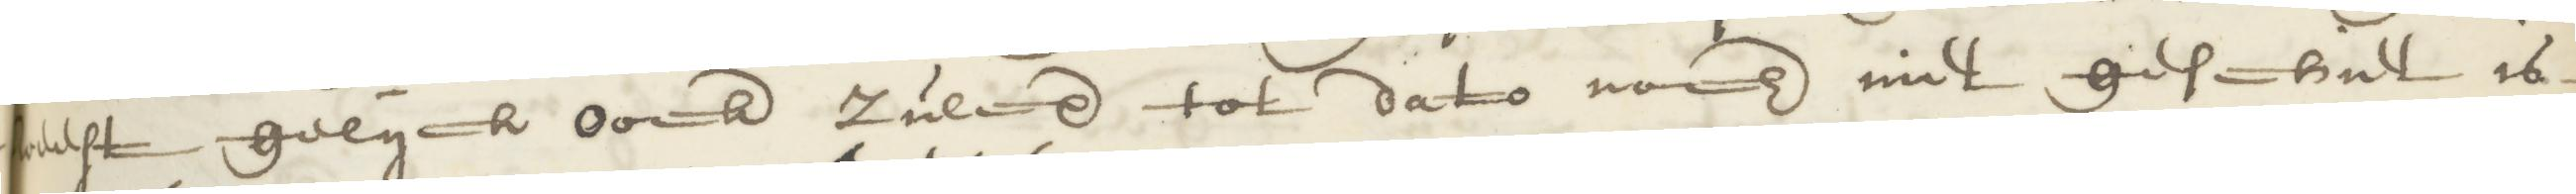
weest gelijck oock zulcx tot dato noch niet geschiet is
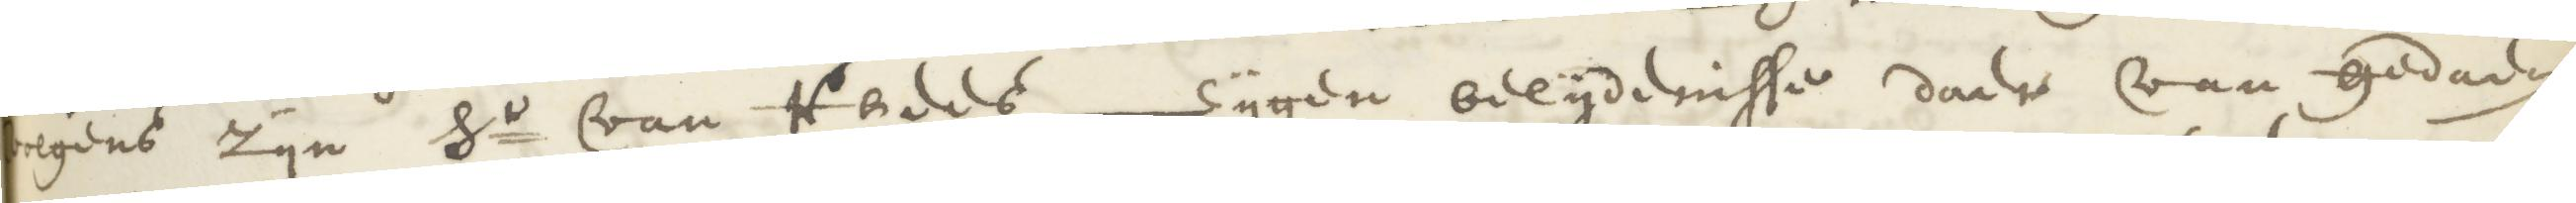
jegens zijn h=r van Rhees eijgen belijdenisse daer van gedaen
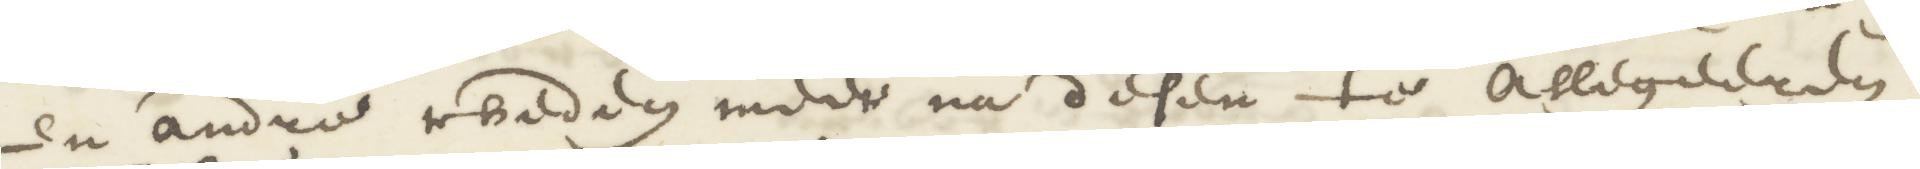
en andre rheden meer na desen te allegeeren
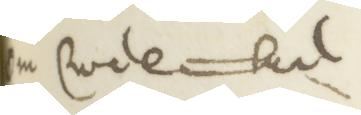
om welcke
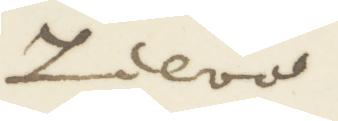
Zelve
